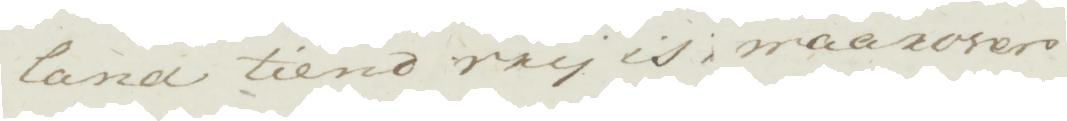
land tiend vrij is, waarover
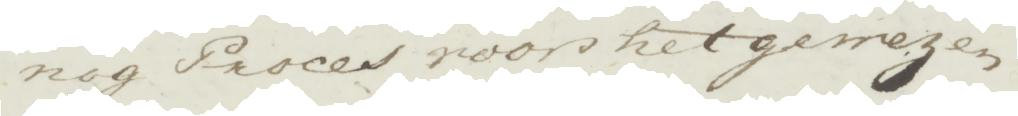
nog Proces voor het gewezen
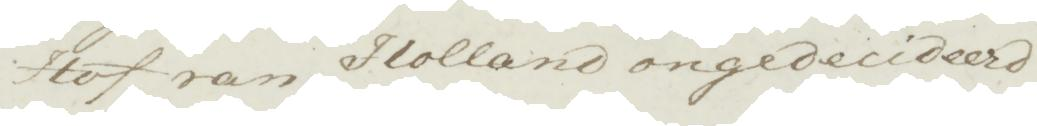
Hof van Holland ongedecideerd
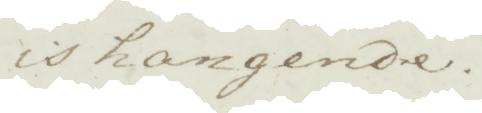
is hangende.
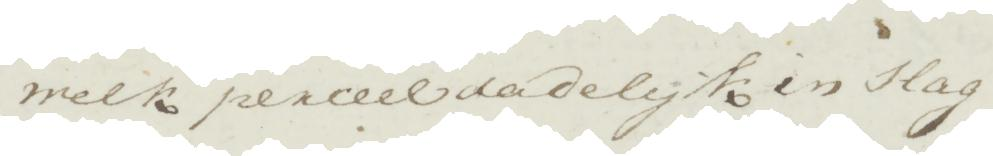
welk perceel dadelijk in slag
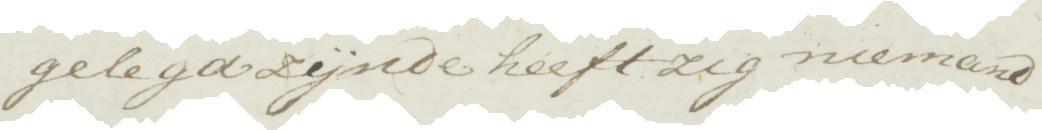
gelegd zijnde heeft zig niemand
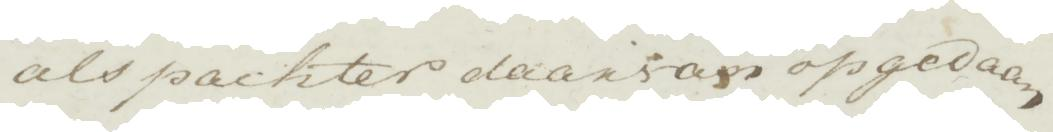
als pachter daarvan opgedaan
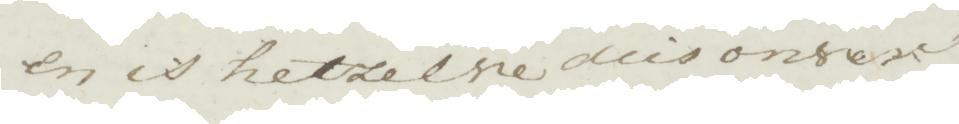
en is hetzelve dus onver
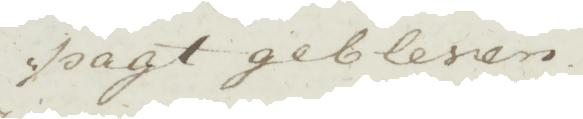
„pagt gebleven.
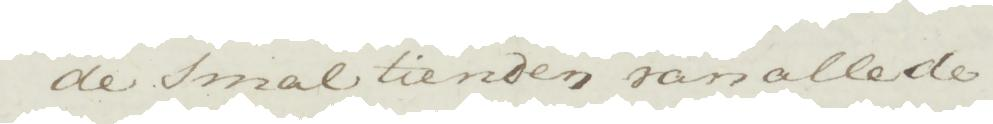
de smal tienden van alle de
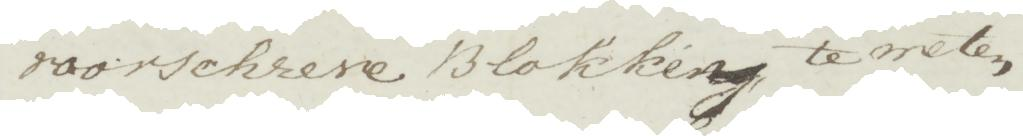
voorschreve Blokkeng, te weten
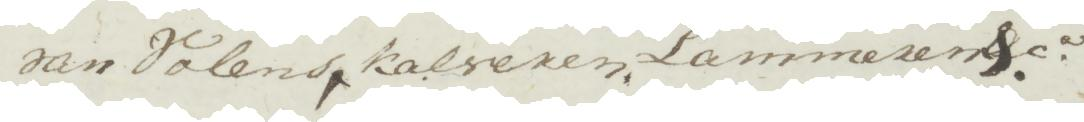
van Volens, kalveren Lammeren &.c.a
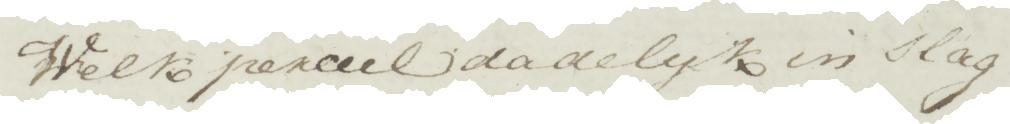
Welk perceel dadelyk in slag
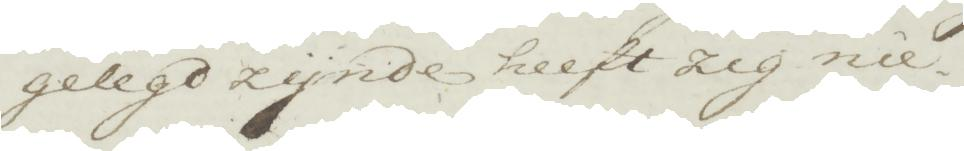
gelegd zijnde heeft zig nie=
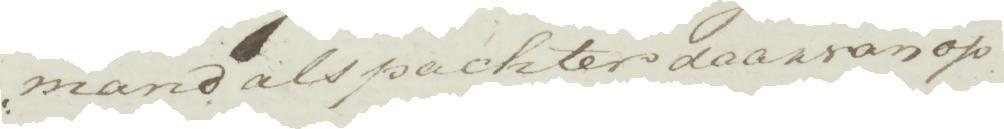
„mand als pachter daarvan op
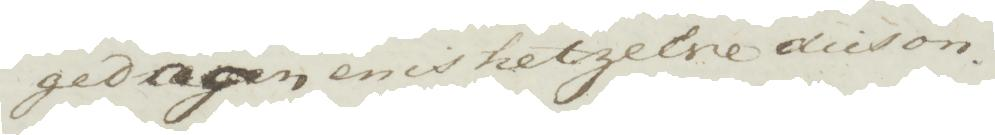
gedagen en is hetzelve die on.
